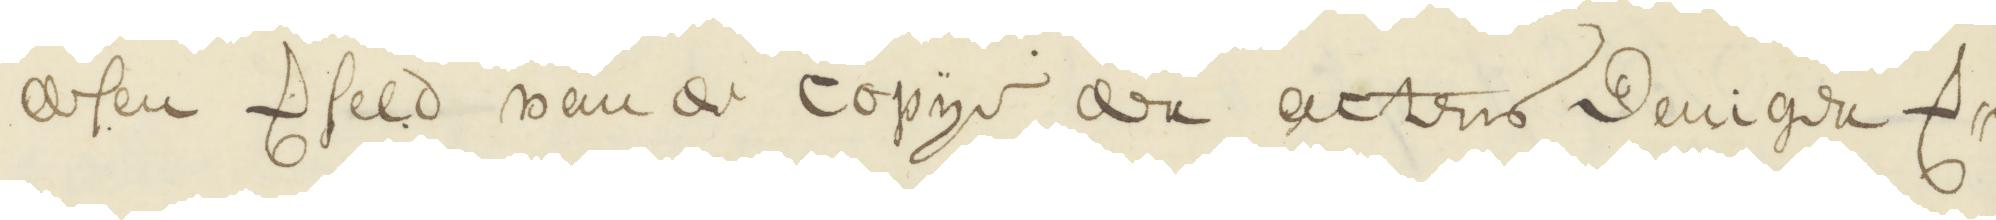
desen verseld van de copije der actens Eeniger ver
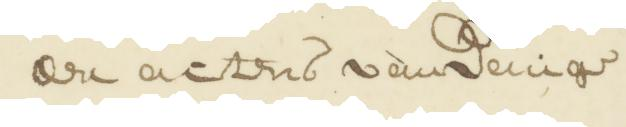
der actens van Eenige
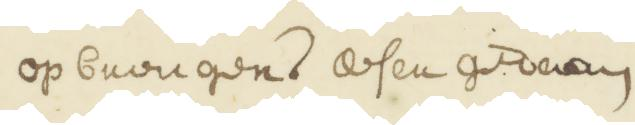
opbrengens desen gedaan
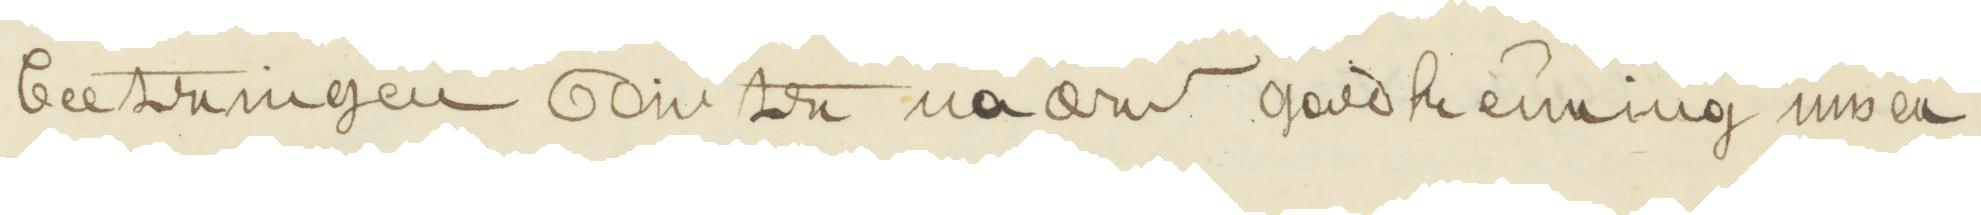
beeteringen die ter nadere goedkeuring uwer
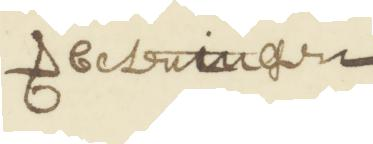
verbeteringen
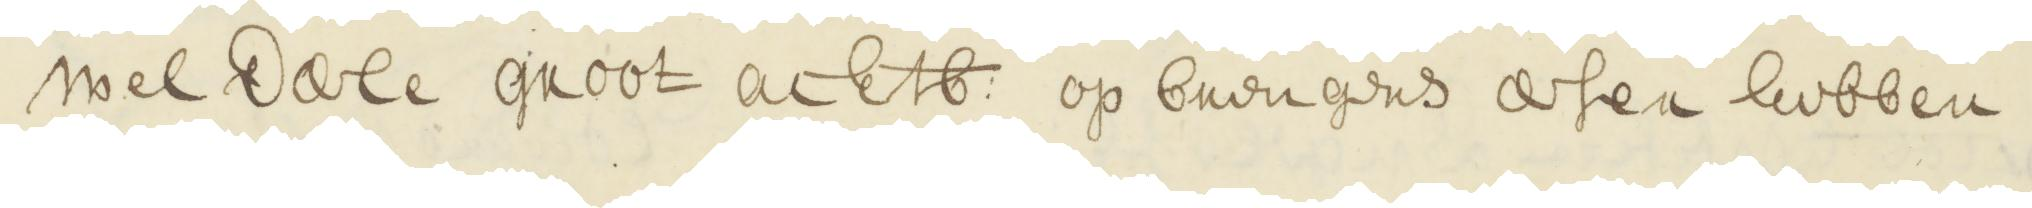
wel Edele groot achtb: op brengers deser hebben
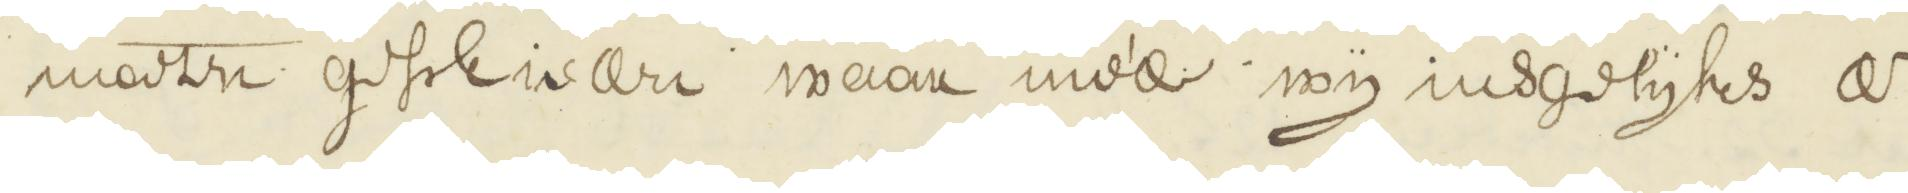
moeten geschieden waar mede wij insgelijks de
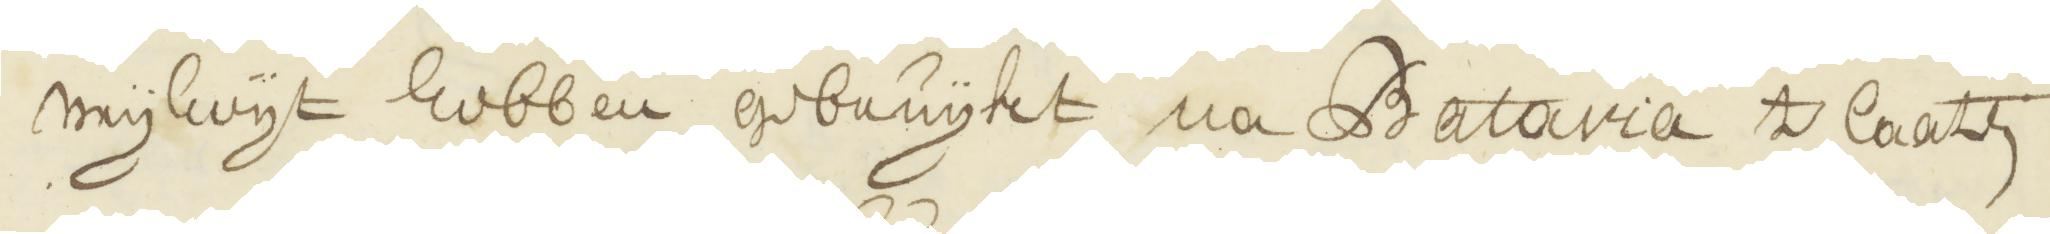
vrijheijt hebben gebruijkt na Batavia te laaten
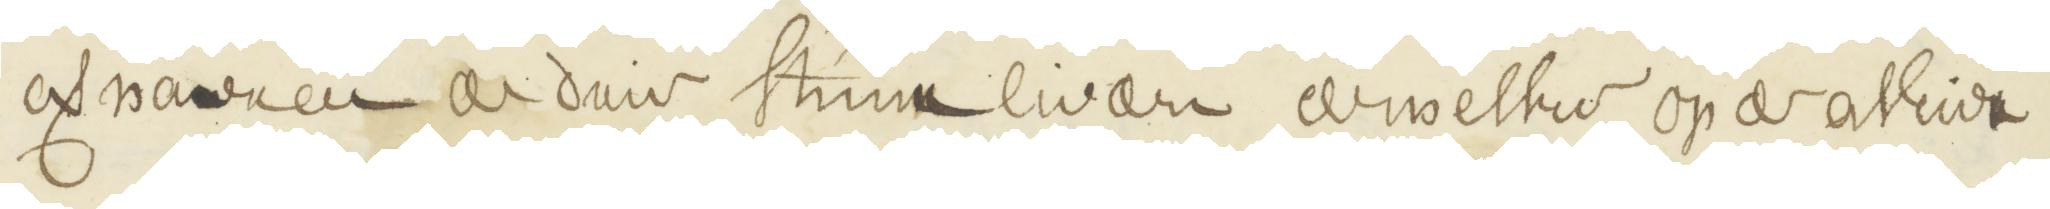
overvaeren de drie stuurlieden dewelke op de alhier
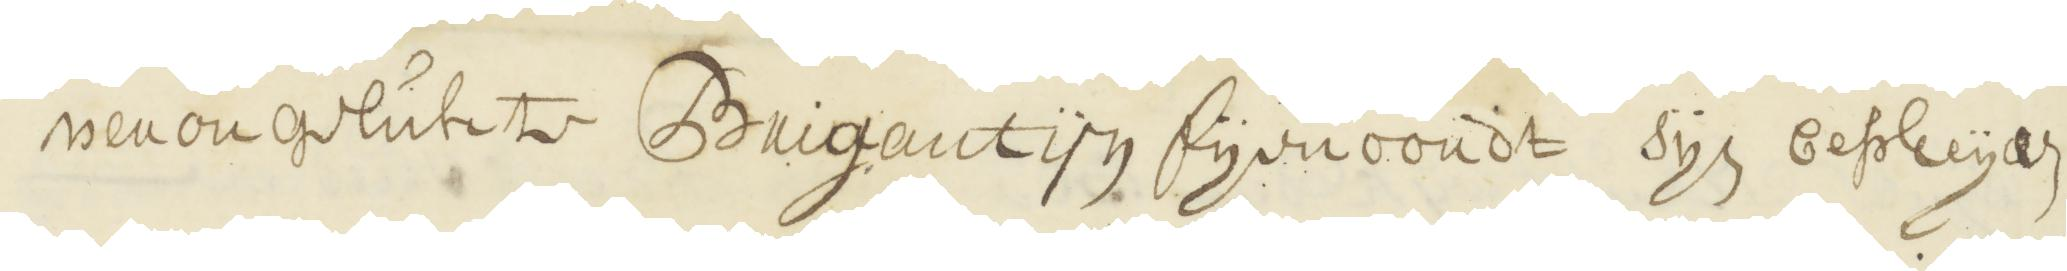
verongelukte Brigantijn fijenoordt sijn bescheijden
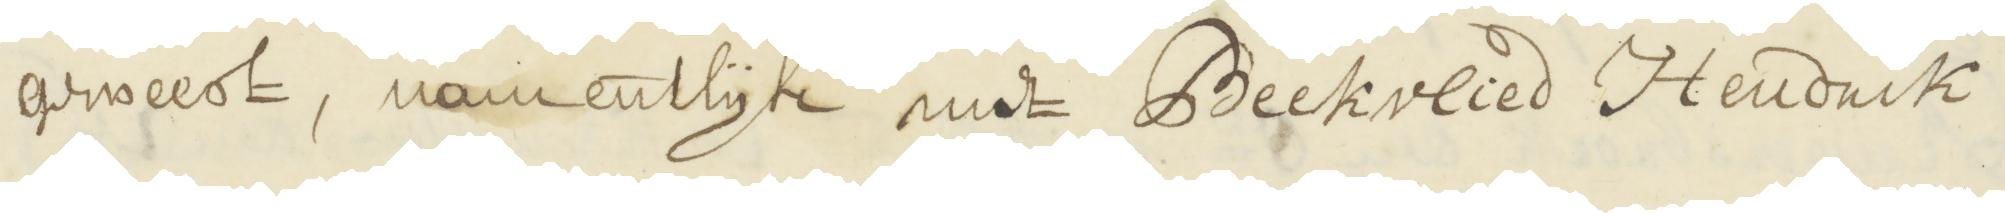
geweest, namentlijk met Beekvlied Hendrik
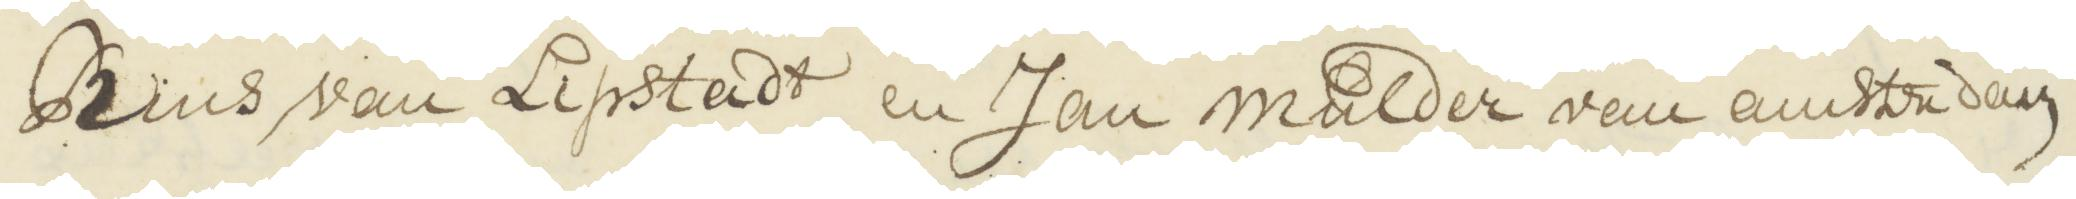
Rins van Lipstadt en Jan mulder van amsterdam
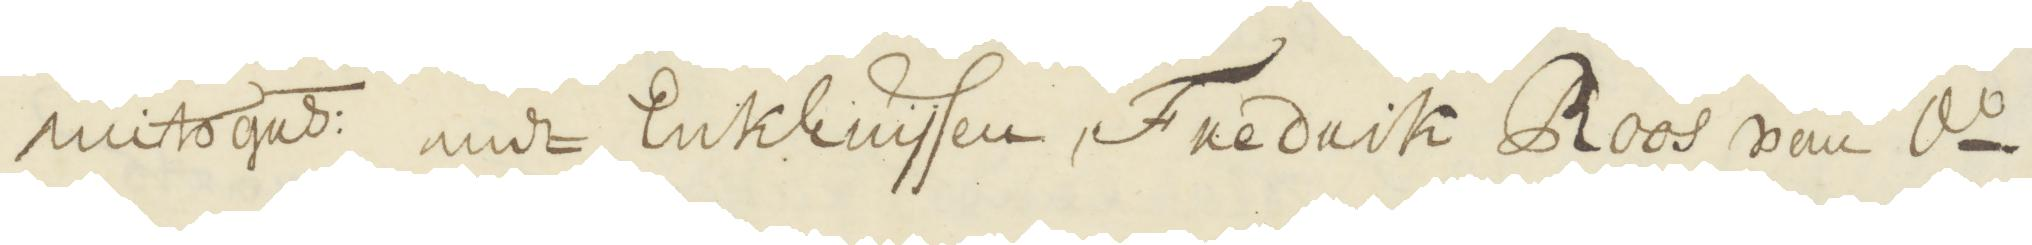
mitsgrs: met Enkhuijsen, Fredrik Roos van d=o
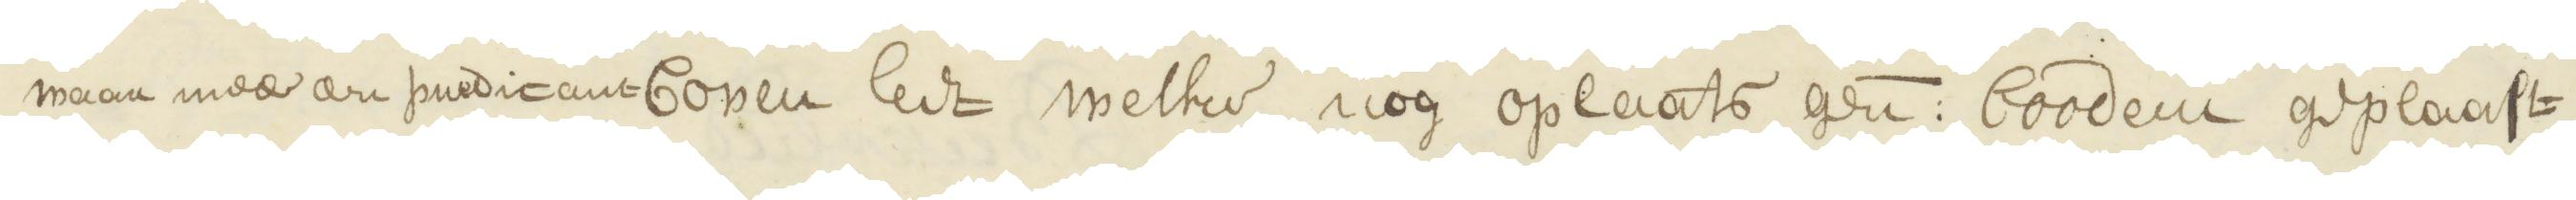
waar mede den predicant boven het welke nog oplaats gen: boodem geplaast
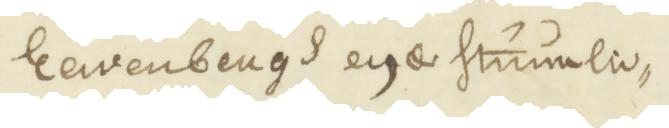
havenbergs en de stuurlie„
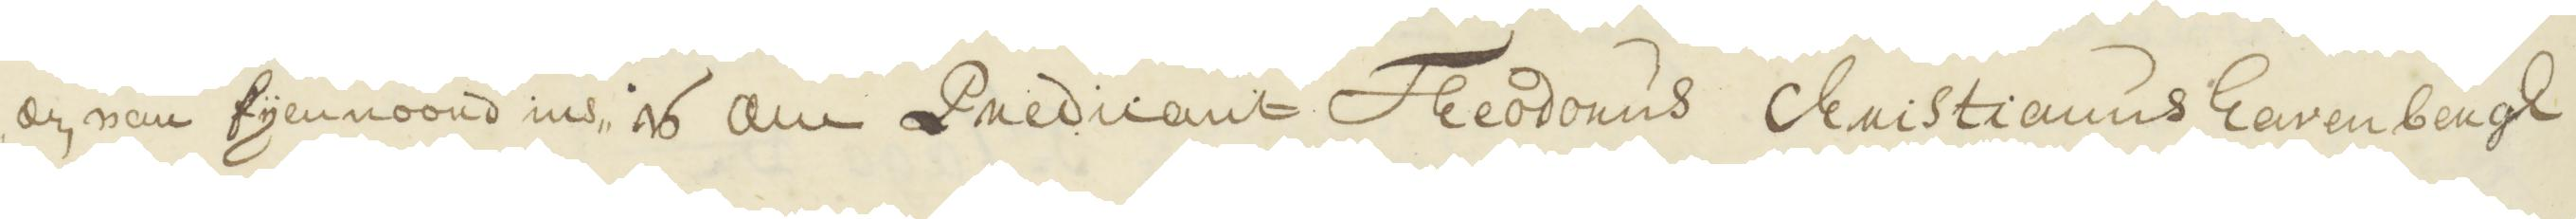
„den van fijennoord ins„ is den Predicant Theodorus Christianus havenbergh
